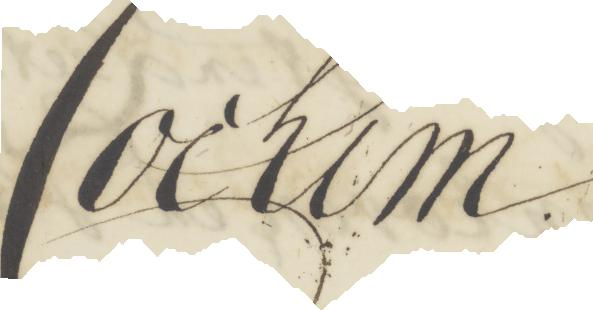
Cochim.
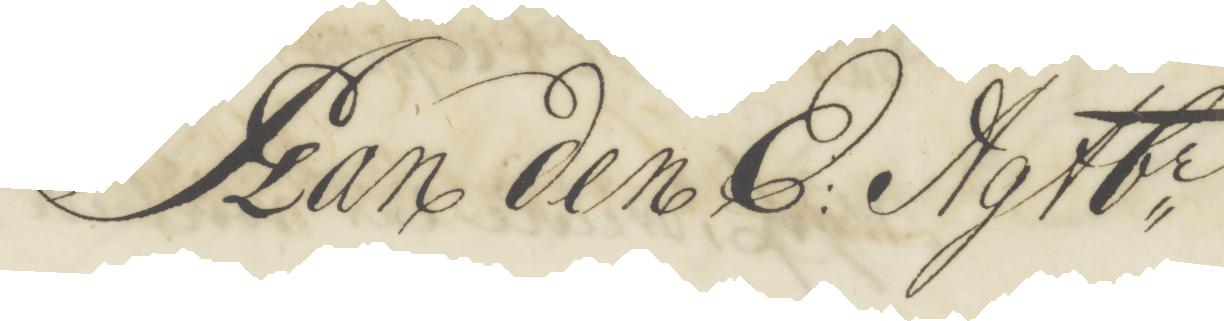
Aan den E: Agtb„r
